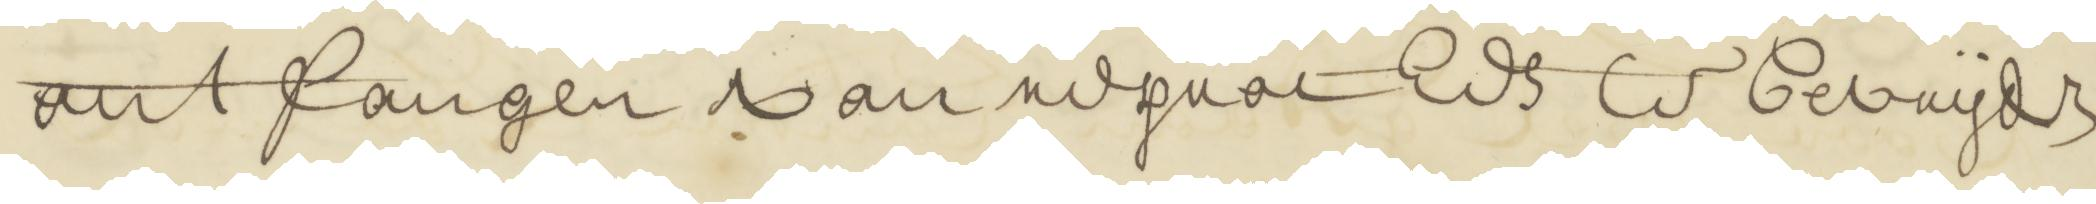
ontfangen van reprocheen te bevrijden
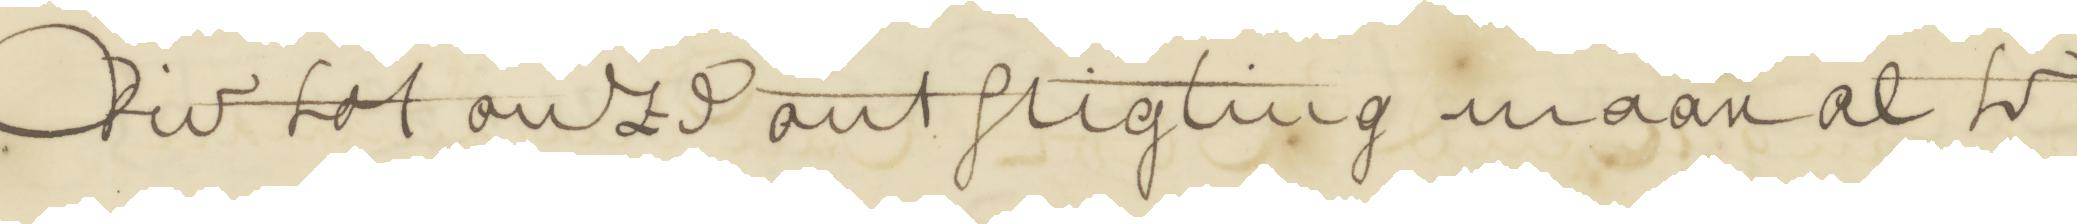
die tot onze ontstigting maar al te
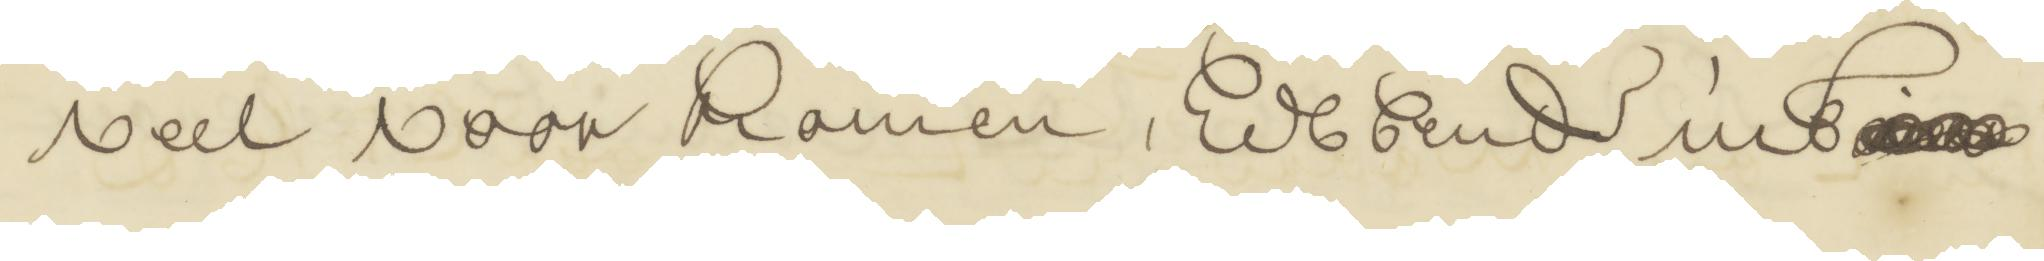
veel voor komen, hebbende uE in
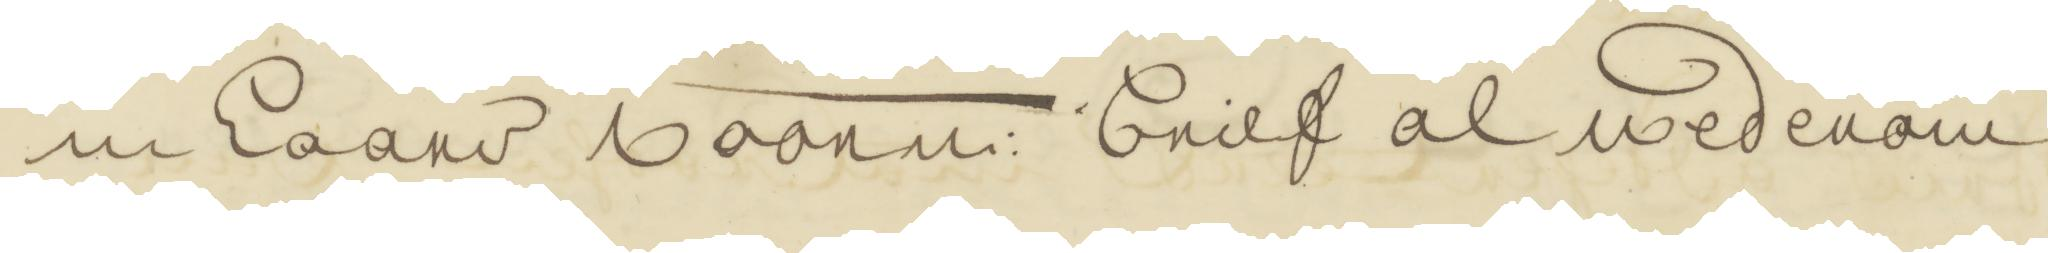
in haare voorm: brief al wederom
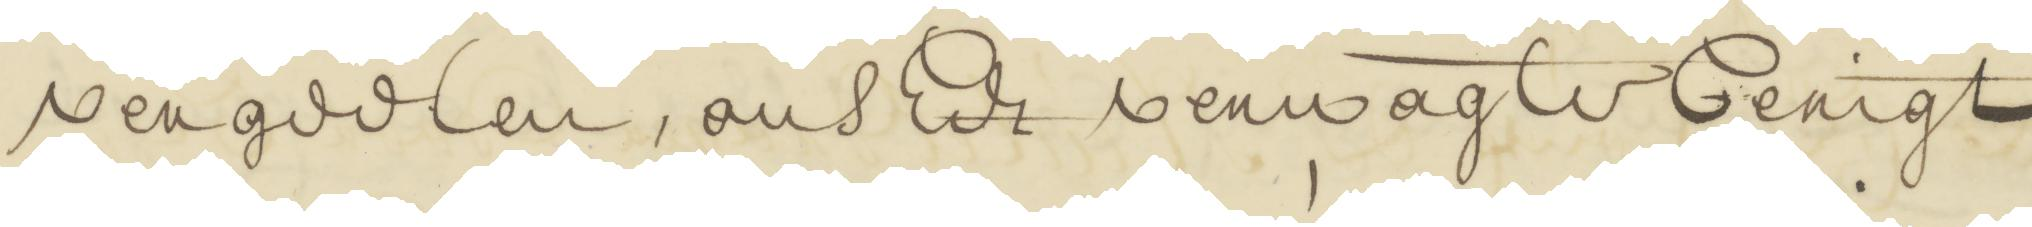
vergeeten, ons het verwagte berigt
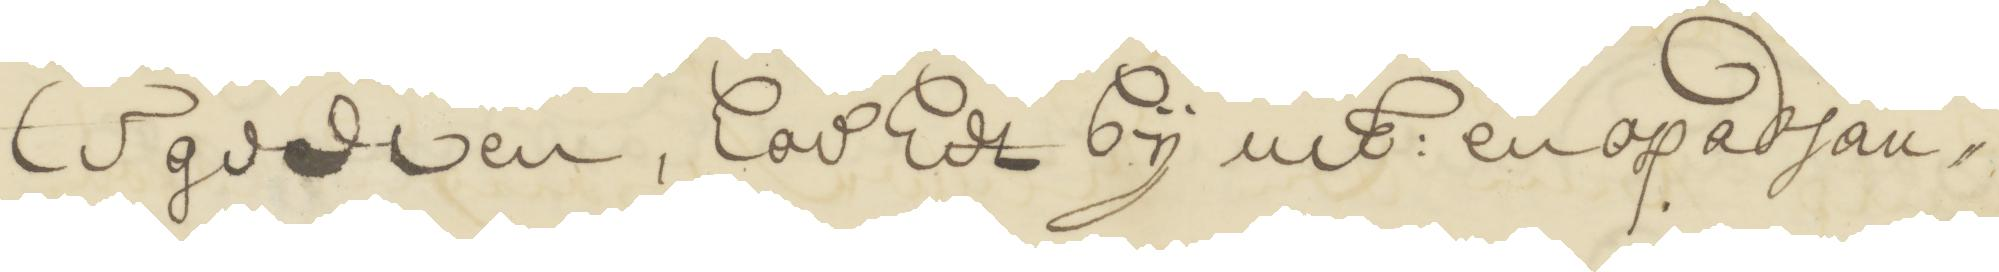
te geeven, hoe het bij uE. en op adjar„
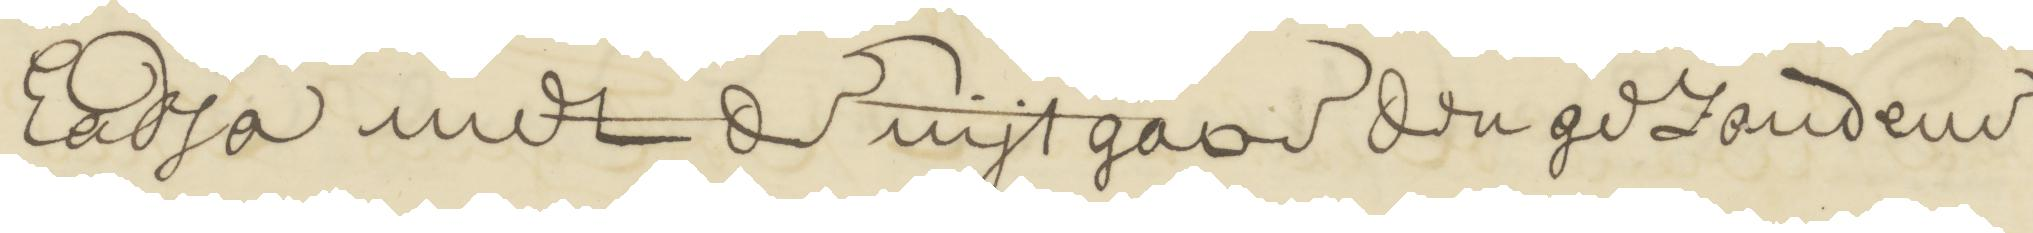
hadja met de uijtgave der gezondene
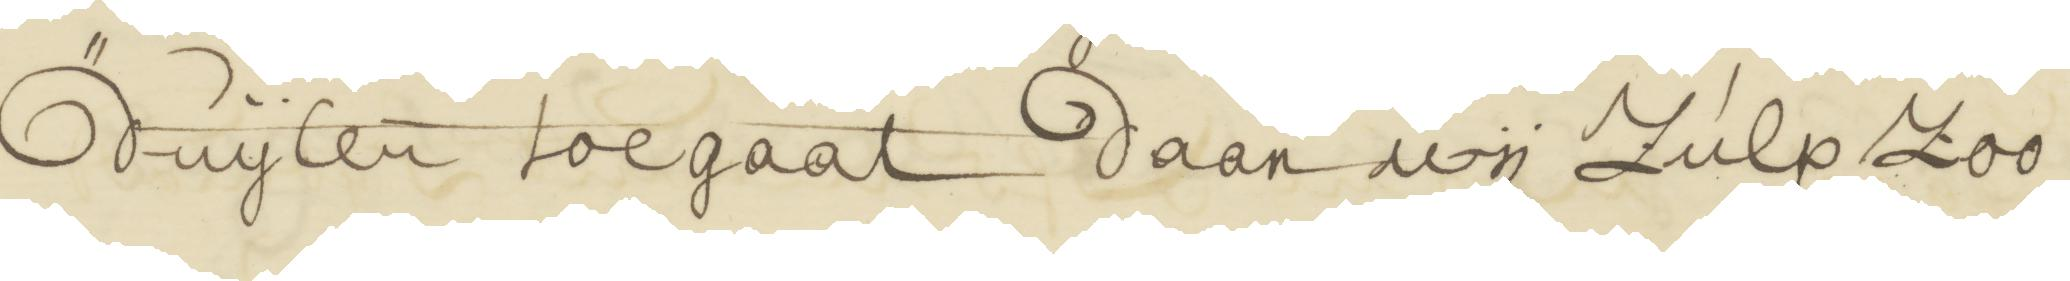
duijten toegaat daar wij Zulx Zoo
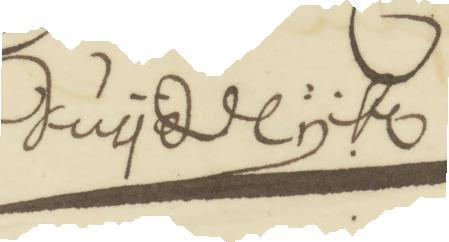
duijdelijk
